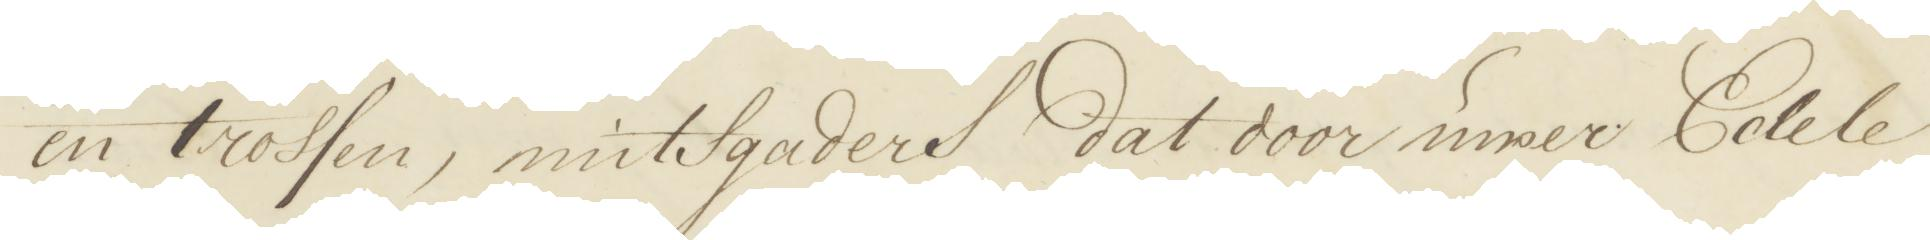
en trossen, mitsgaders dat door uwer Edele
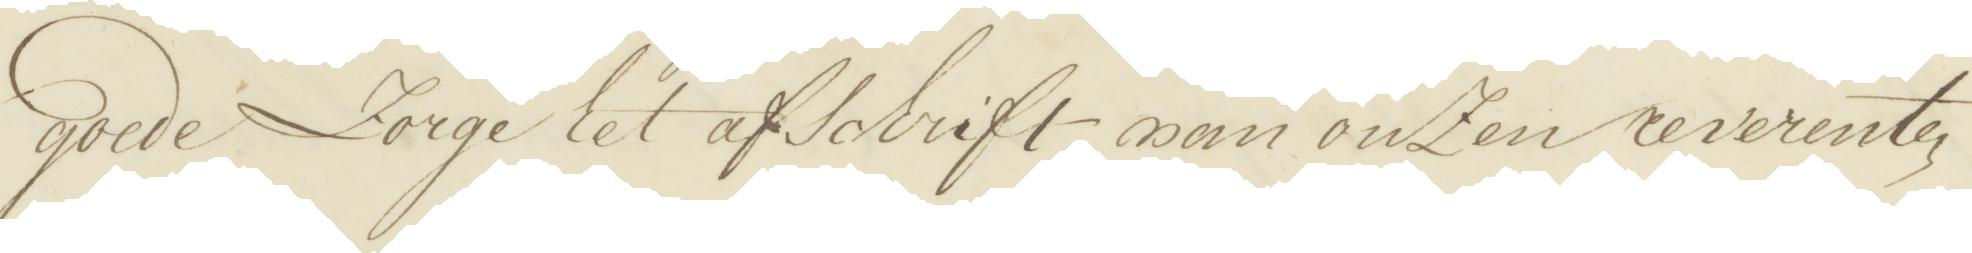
goede zorge het afschrift van onzen reverenten
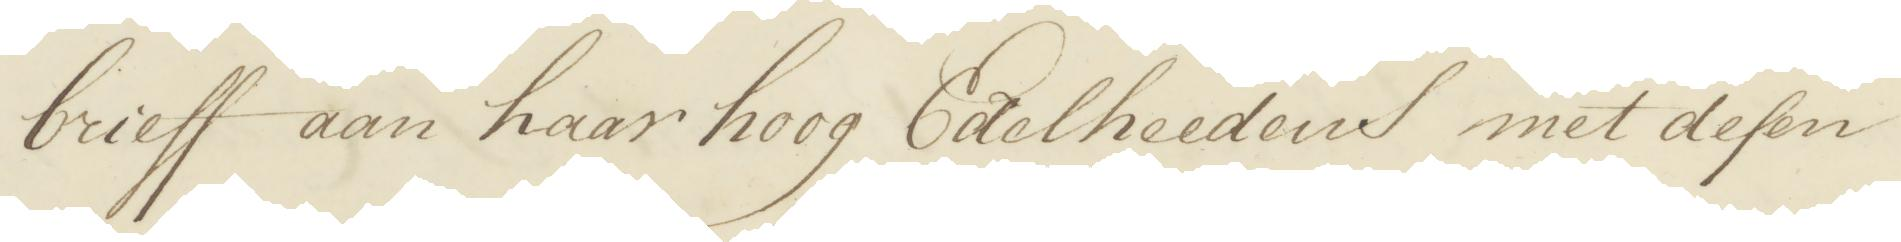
brieff aan haar hoog Edelheedens met desen
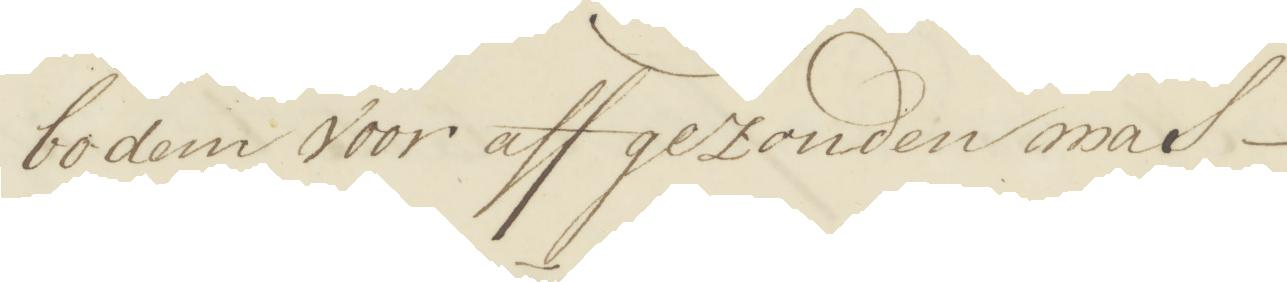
bodem voor aff gezonden was —
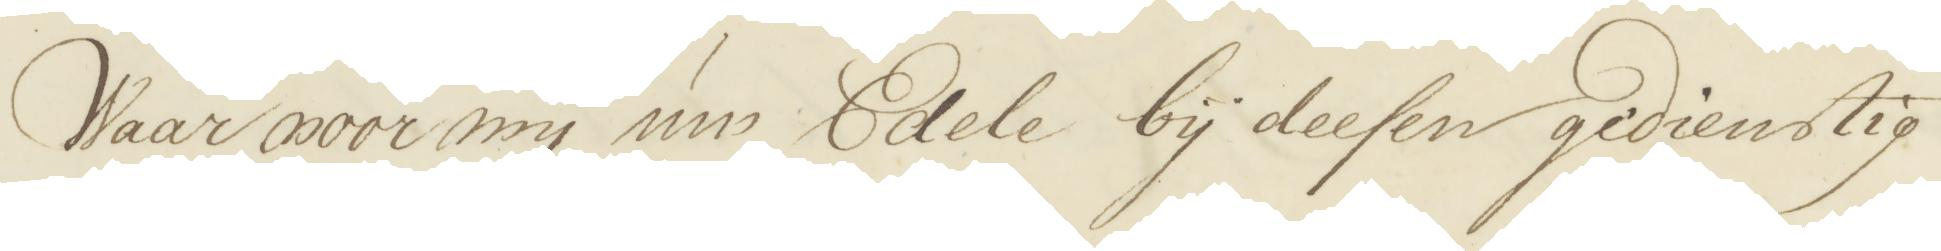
Waar voor wij uw Edele bij deesen gedienstig
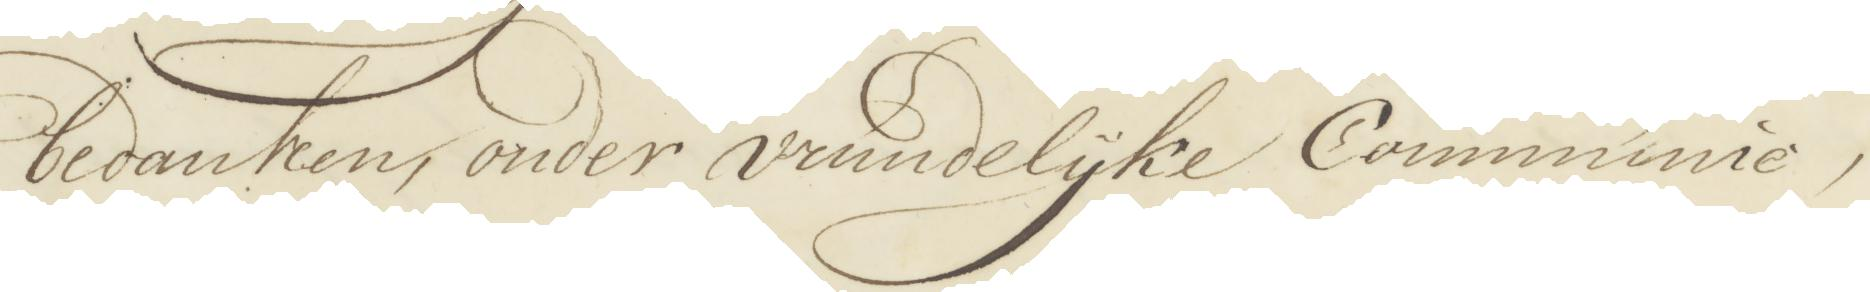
bedanken, onder vrundelijke Communie,
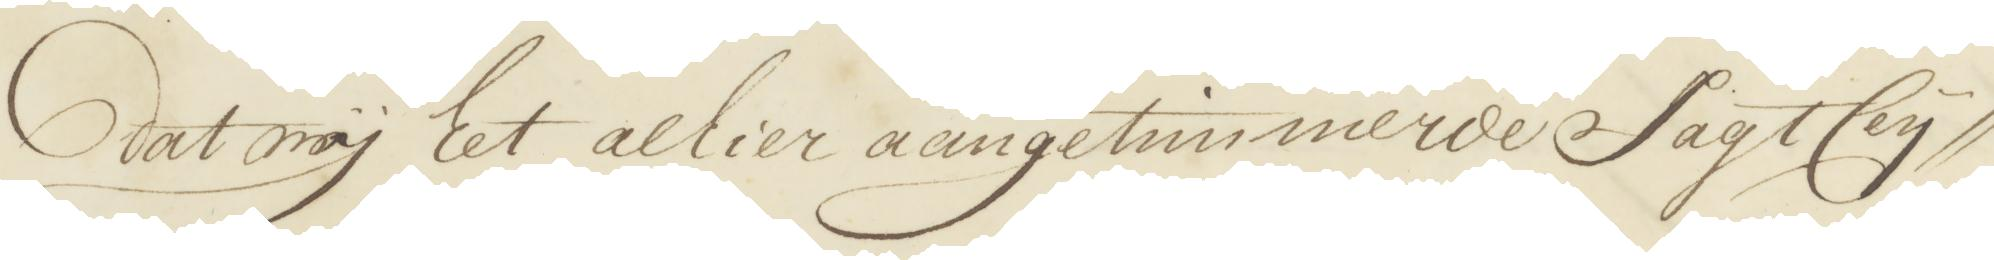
dat wij het alhier aangetimmerde Jagt Ceij„
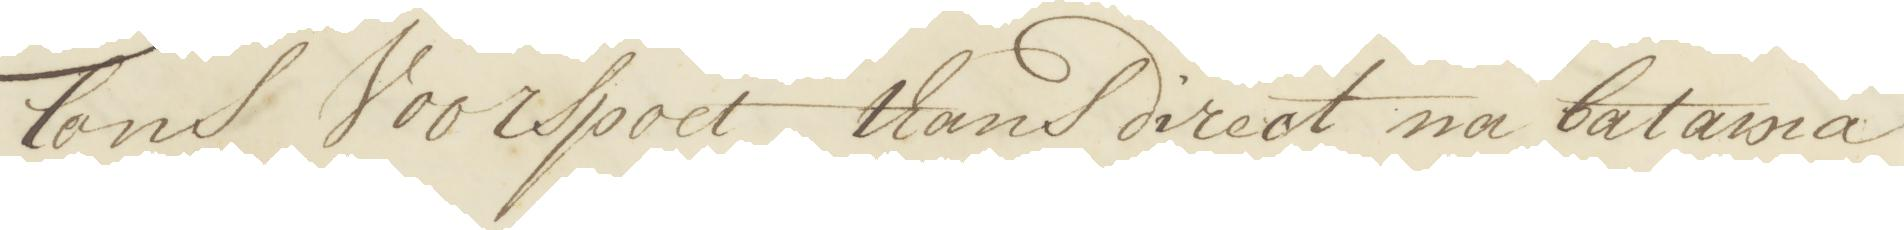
lons Voorspoet thans direct na batavia
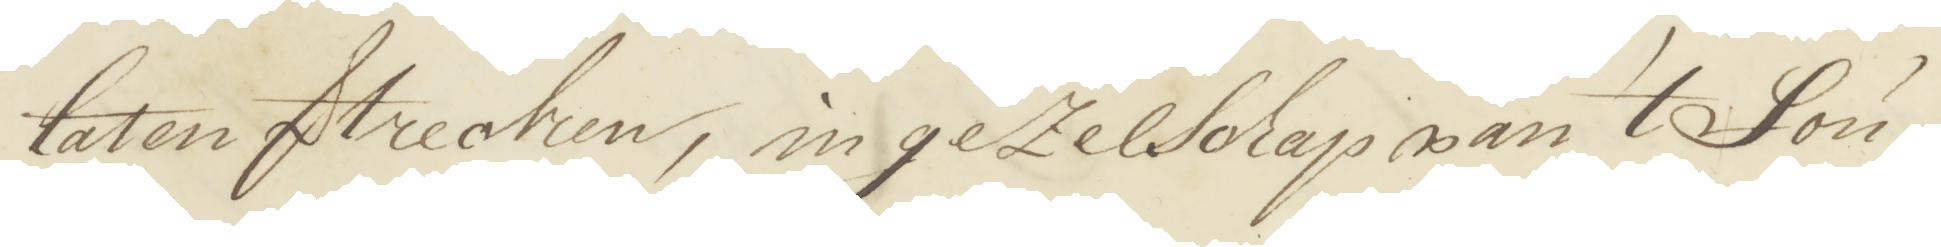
laten vertrecken, in gezelschap van ’t Sou„
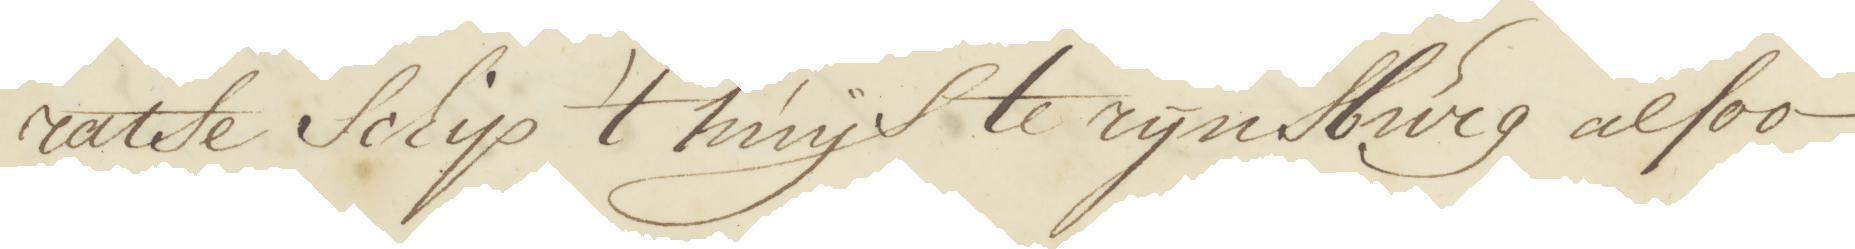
ratse schip ’t huijs te rijnsburg alsoo —
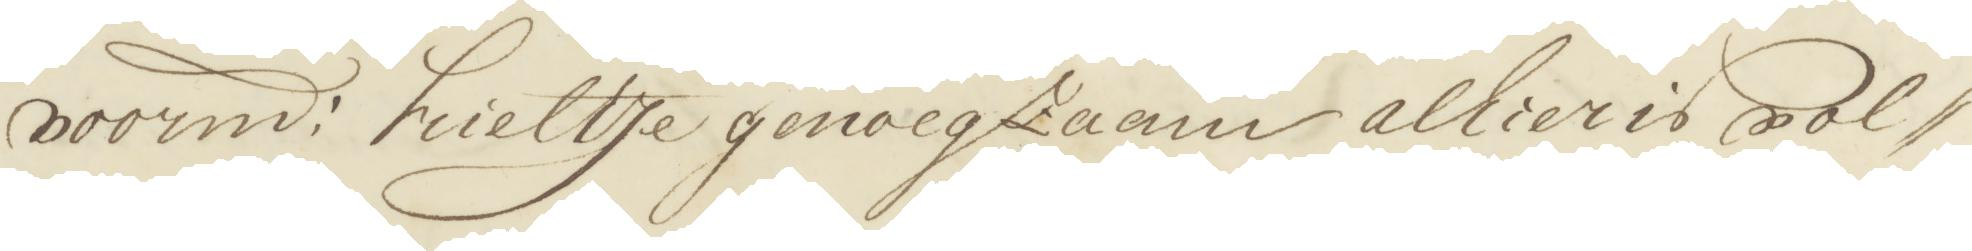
voorm: kieltje genoegzaam alhier is vol„
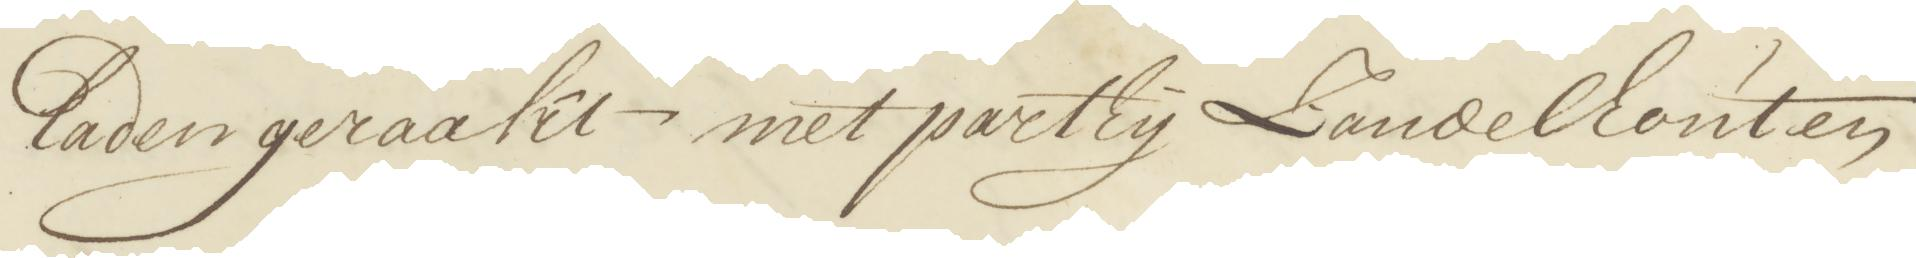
laden geraakt met parthij zandelhouten
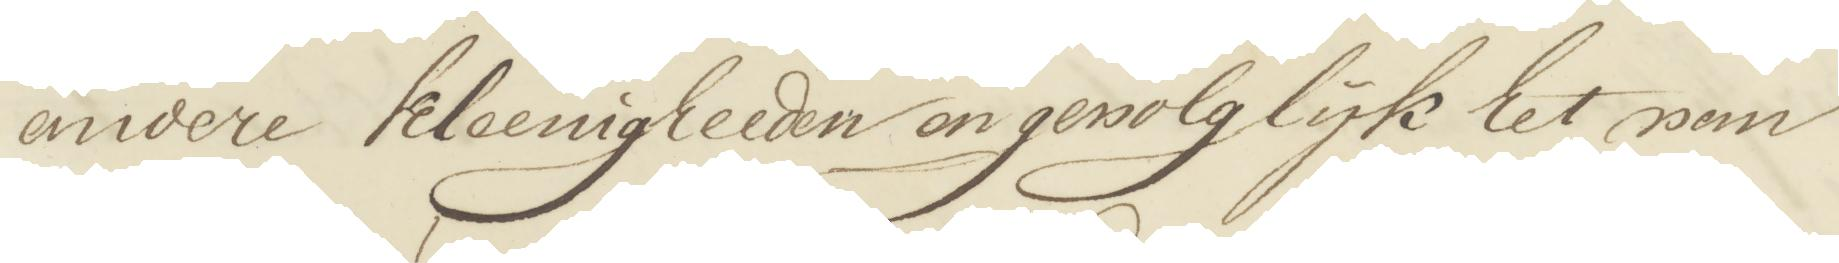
andere kleenigheeden en gevolglijk het van
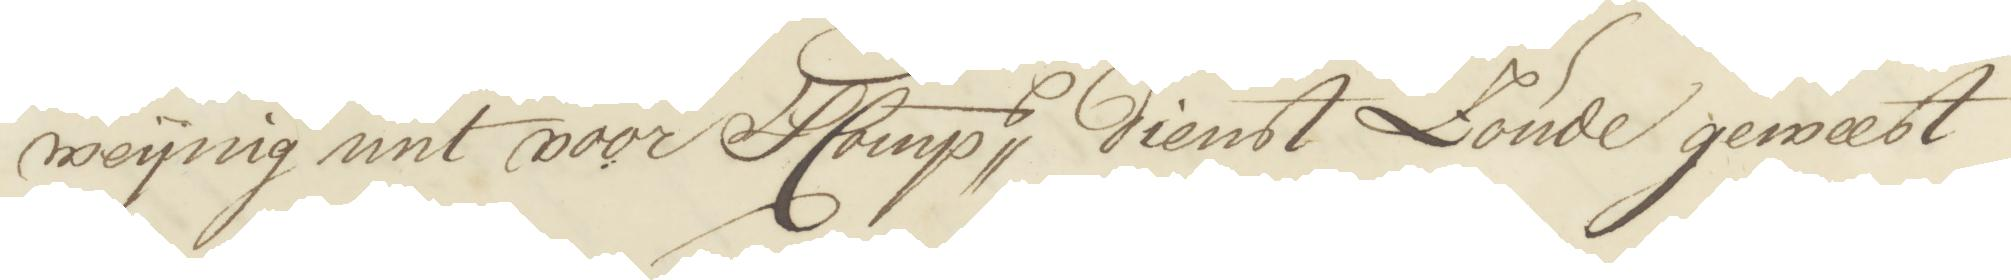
weijnig nut voor 's Comp„s dienst zoude geweest
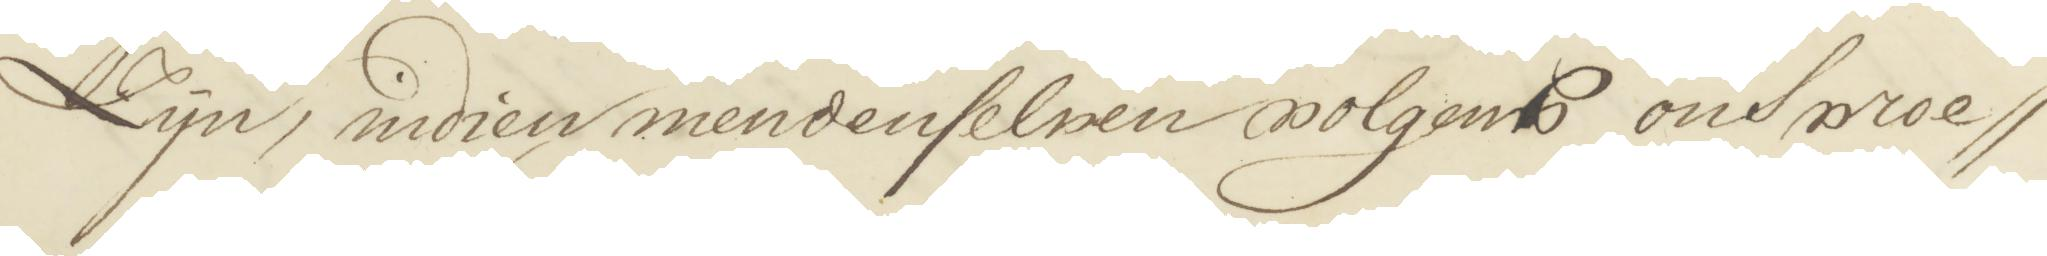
zijn, indien men denselven volgens ons vroe„
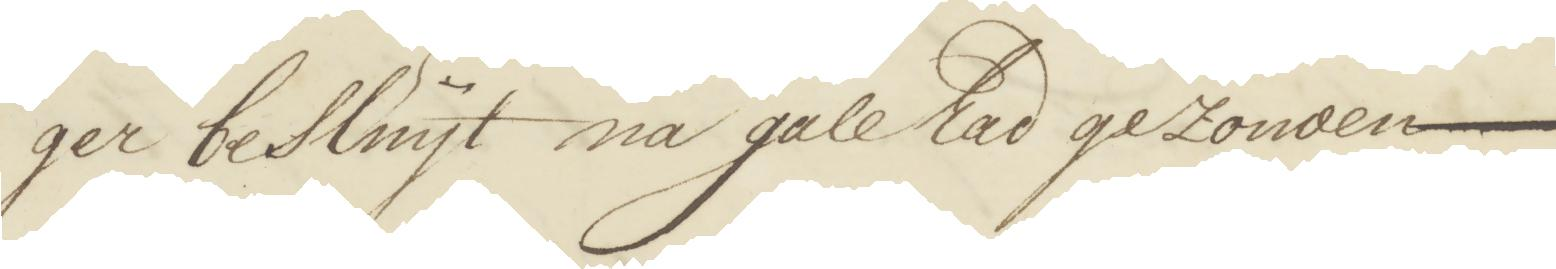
ger besluijt na gale had gezonden —
